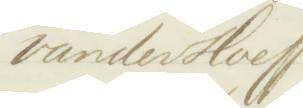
vander Hoeff
